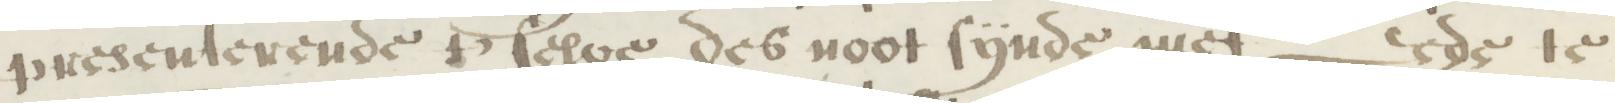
presenterende t'selve des noot sijnde met Eede te
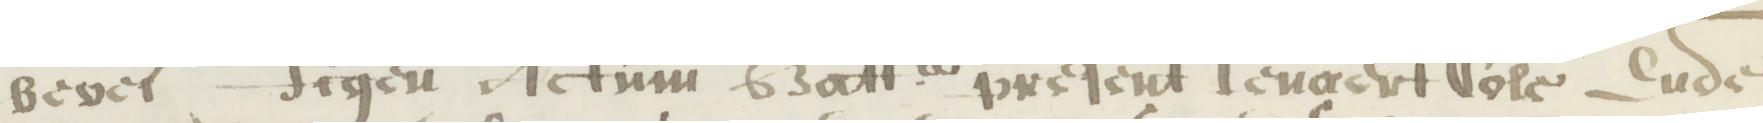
bevestigen Actum Batt.a present lenaert Colc Ende
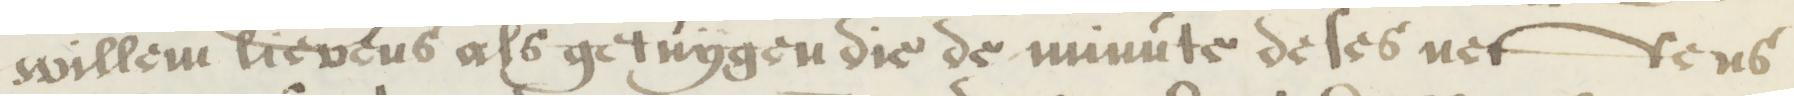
willem lievens als getuijgen die de minuts deses neffens
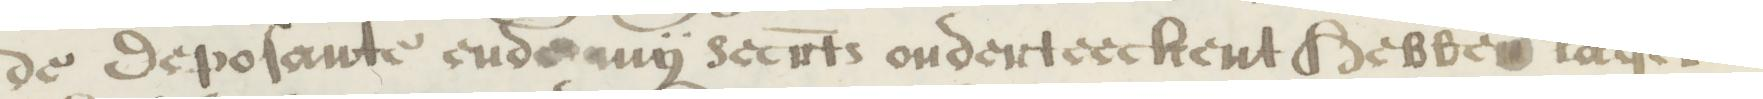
de Deposante ende mij secrts onderteeckent hebben lager
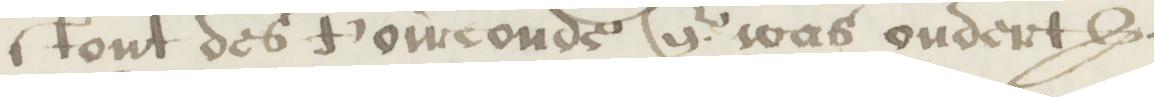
stont des t'oirconde ende was ondert. Gerrit Jans.n
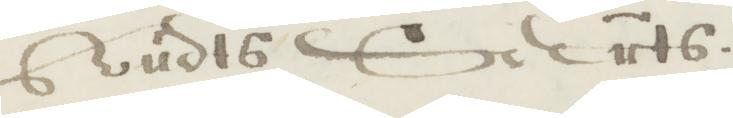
Rudts Secrts.
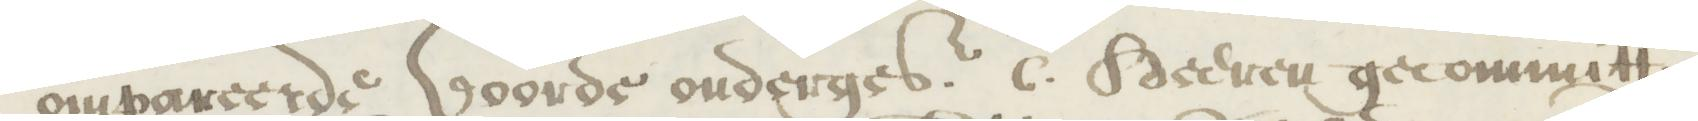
Compareerde voorde onderges.n E. Heeren gecommitt.n
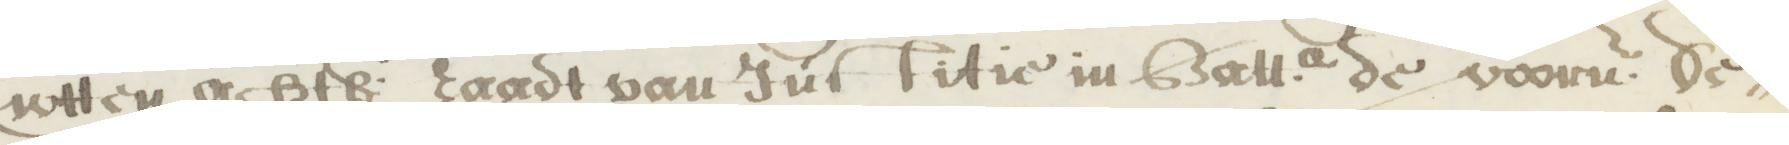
wtten achtb: raadt van Iustitie in Batt.a de voorn.n de„
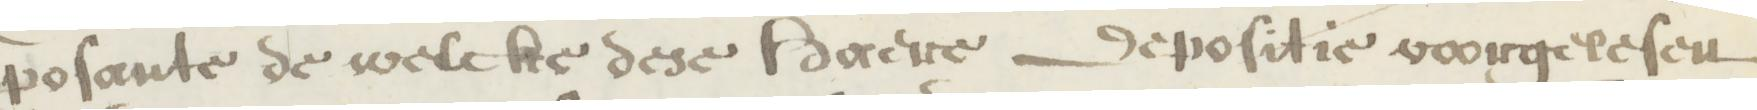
posante de welcke dese haere Depositie voorgelesen
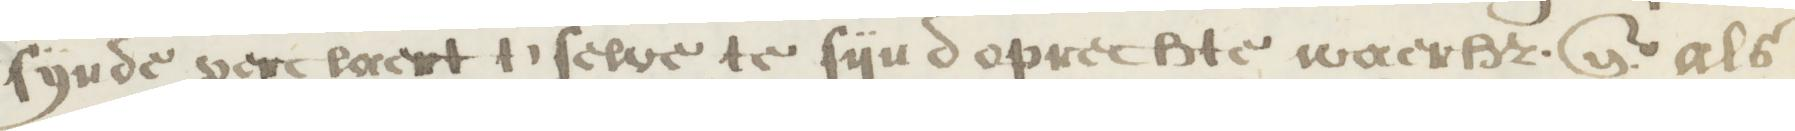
sijnde verclaert t'selve te sijn d oprechte waerhz. ende als
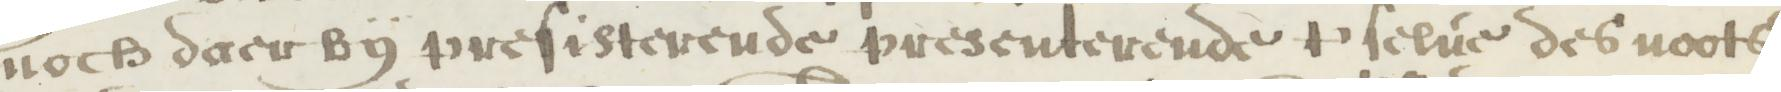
noch daer bij presisterende presenterende t'selue des noots
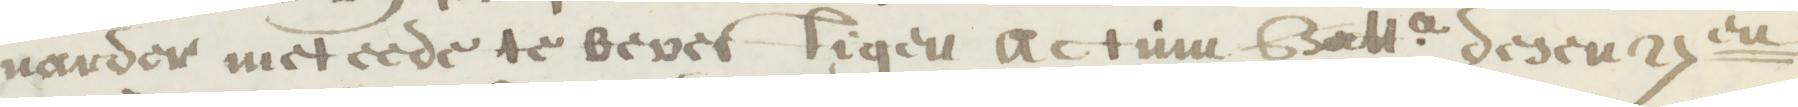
narder met eede te bevestigen actum Batt.a desen 27=en
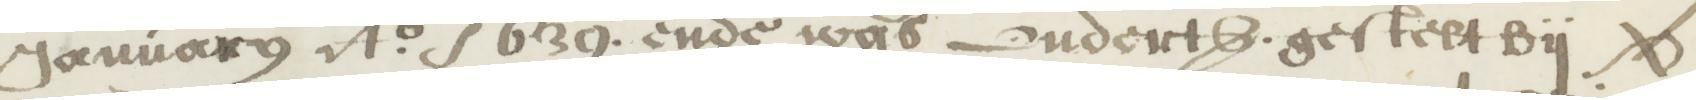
Januarij A.o 1639. ende was ondert. gestelt bij x
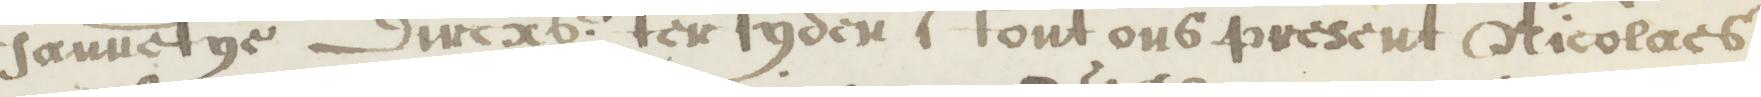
Jannetije dircx: ter sijden stont ons present nicolaes
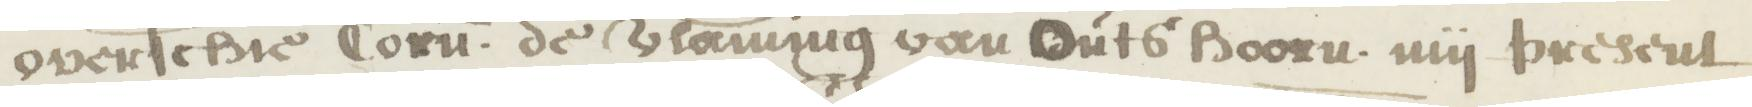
overschie Corn. de vlaming van Outshoorn. mij present
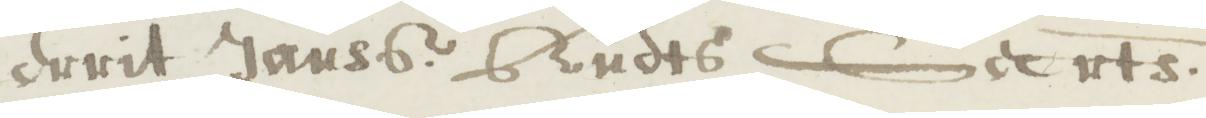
Gerrit Janss. Rudts Secrts.
